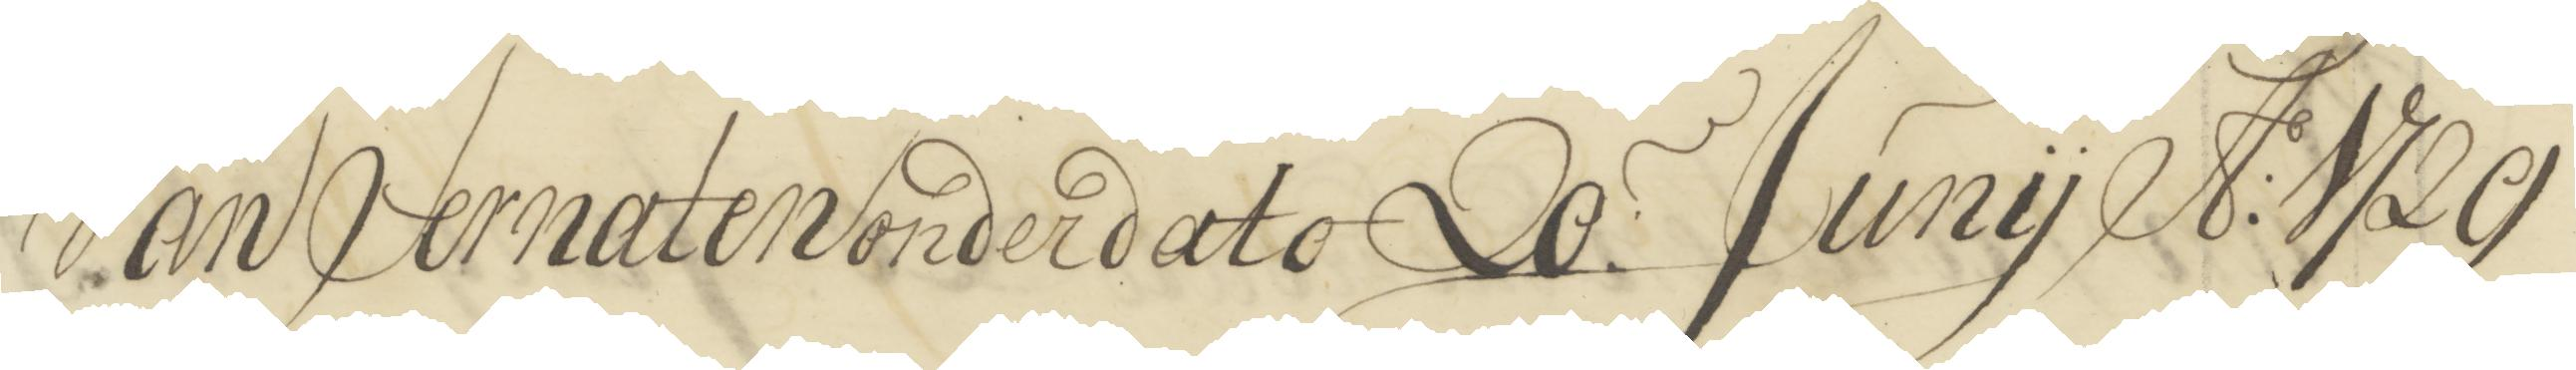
Van Ternaten onder dato 20:' Junij A:o 1729
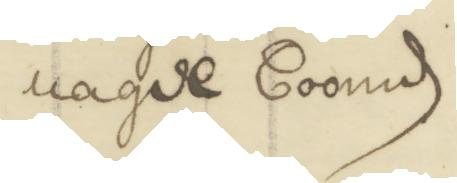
nagel boomen
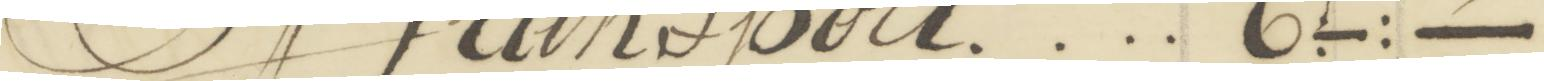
P„r Transport. . . . 6:—:—
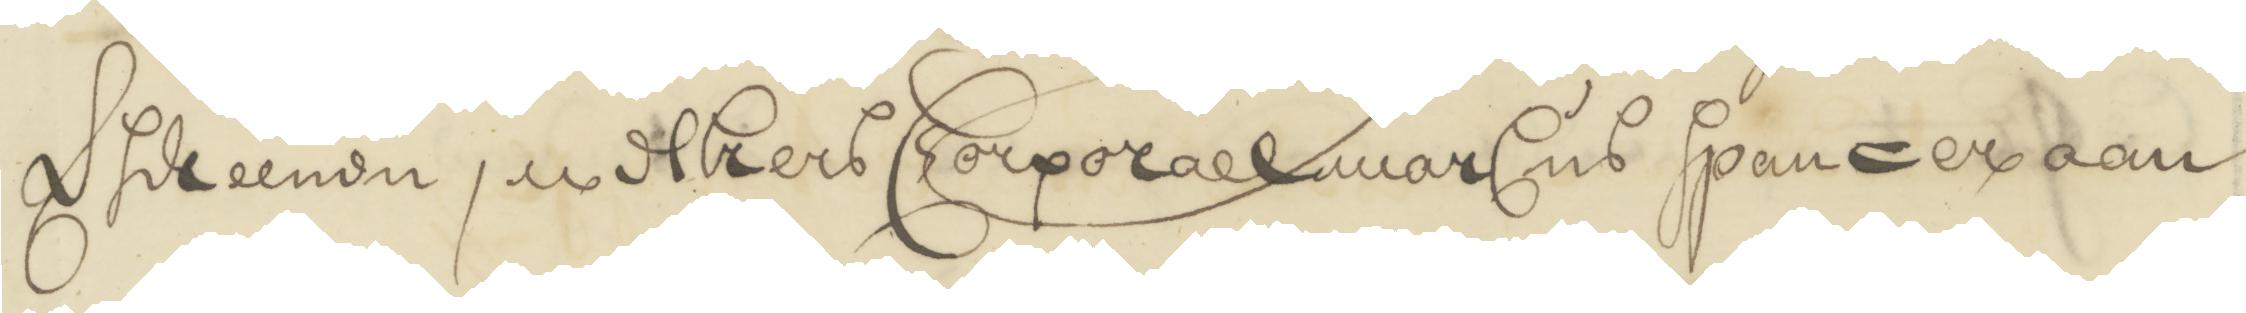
verscheenen, welkers Corporael marcus spancer aan
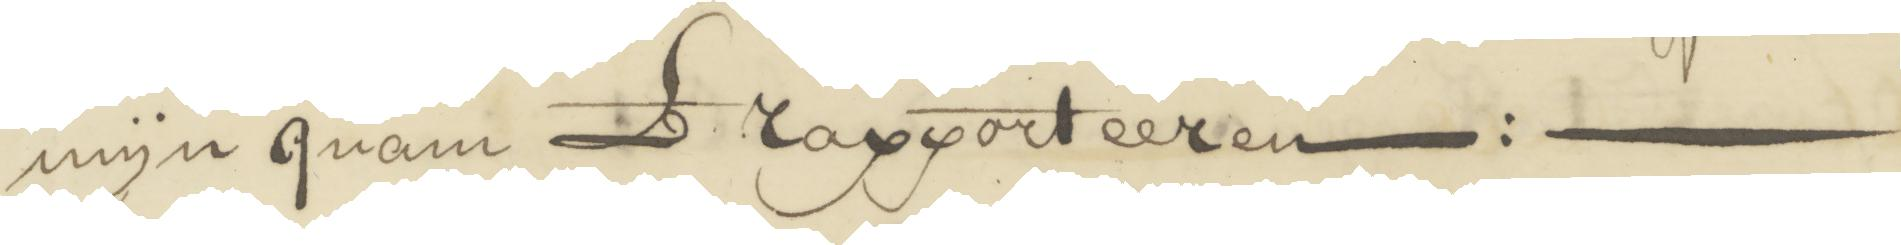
mijn quam te rapporteeren:—
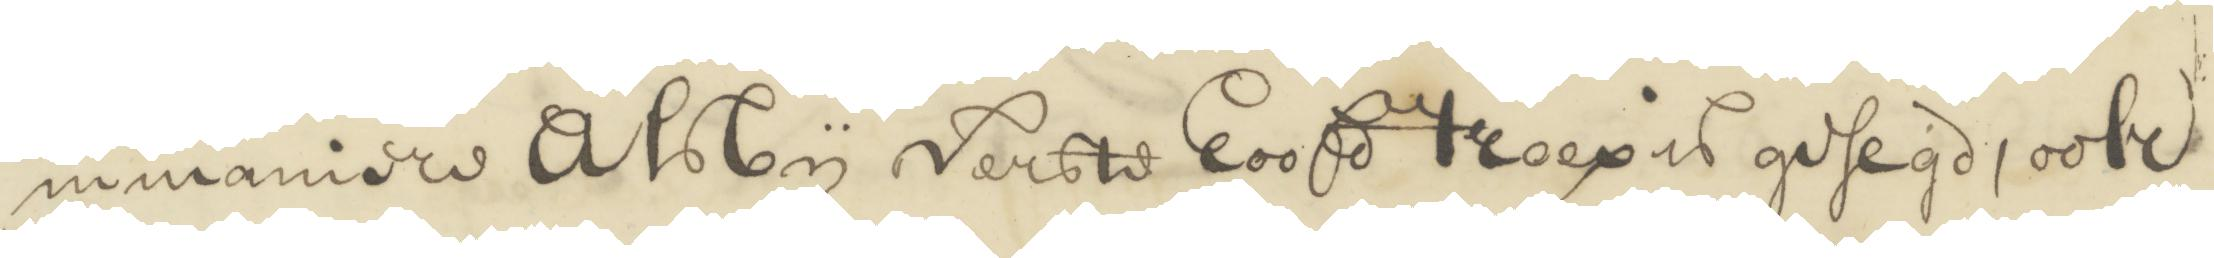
in maniere Alsbij eerste hoofdtroep is gesegd, ook
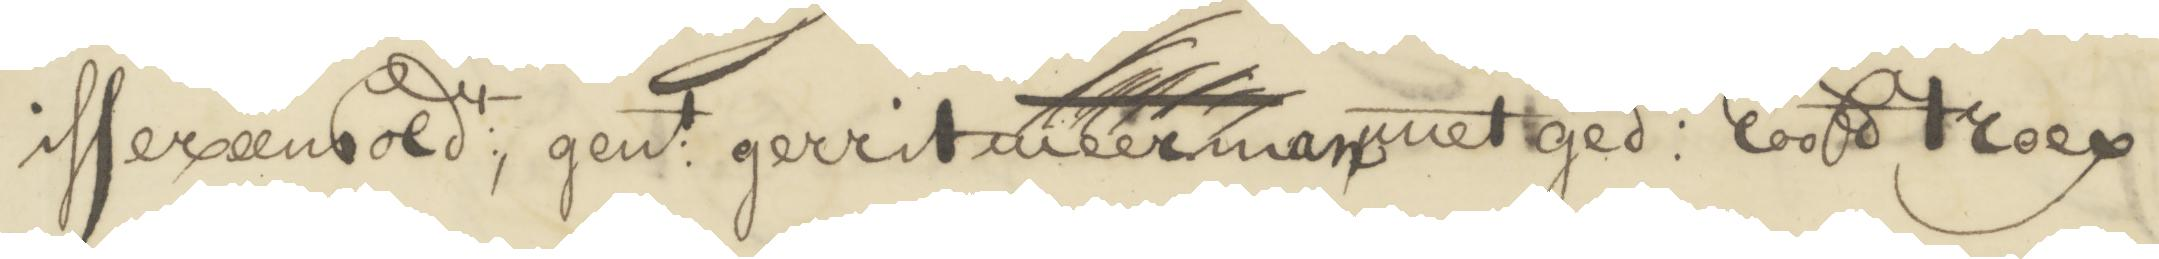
isser eensold:t, gen:t gerrit meerman met ged:te hoofd troep
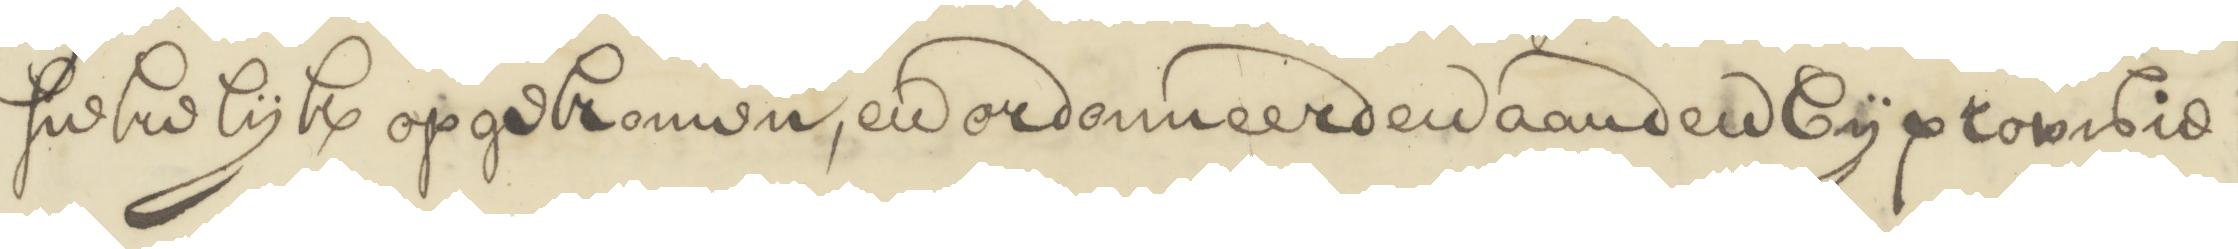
siekelijk op gekomen, en ordonneerd en aan den bij provisie
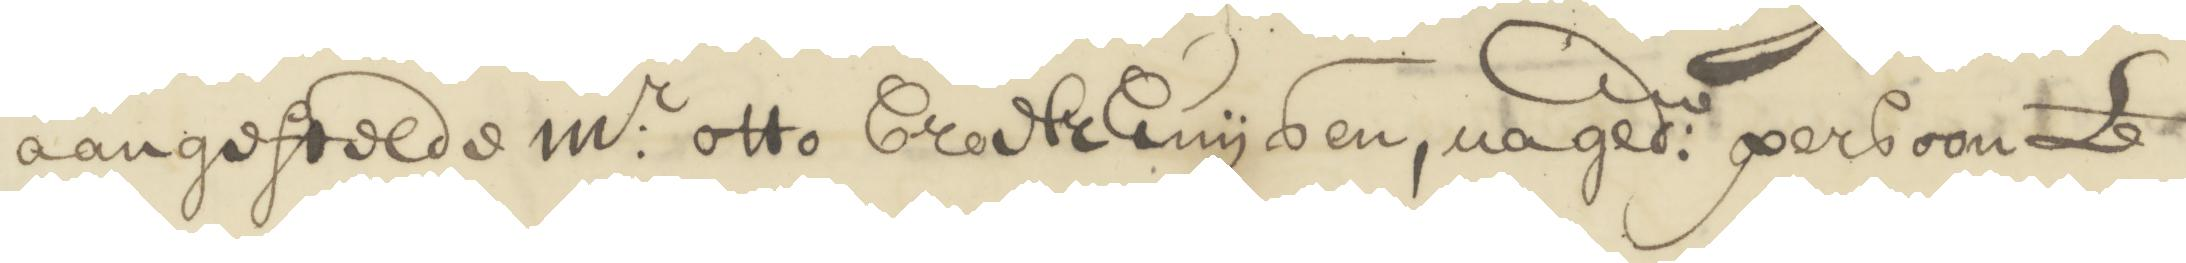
aangestelde m:r otto broekhuijsen, na ged:e persoon te
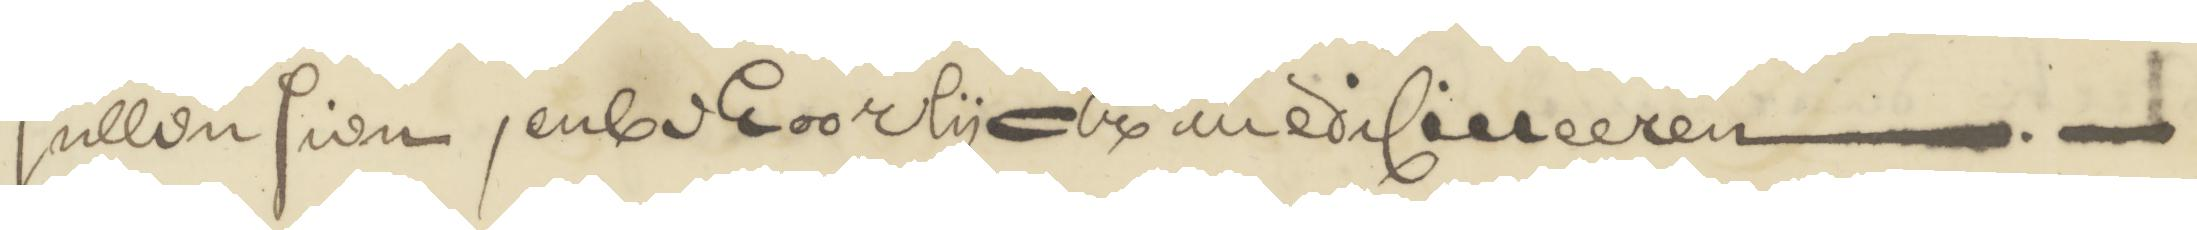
sullen sien, en behoorlijck medicineeren.—
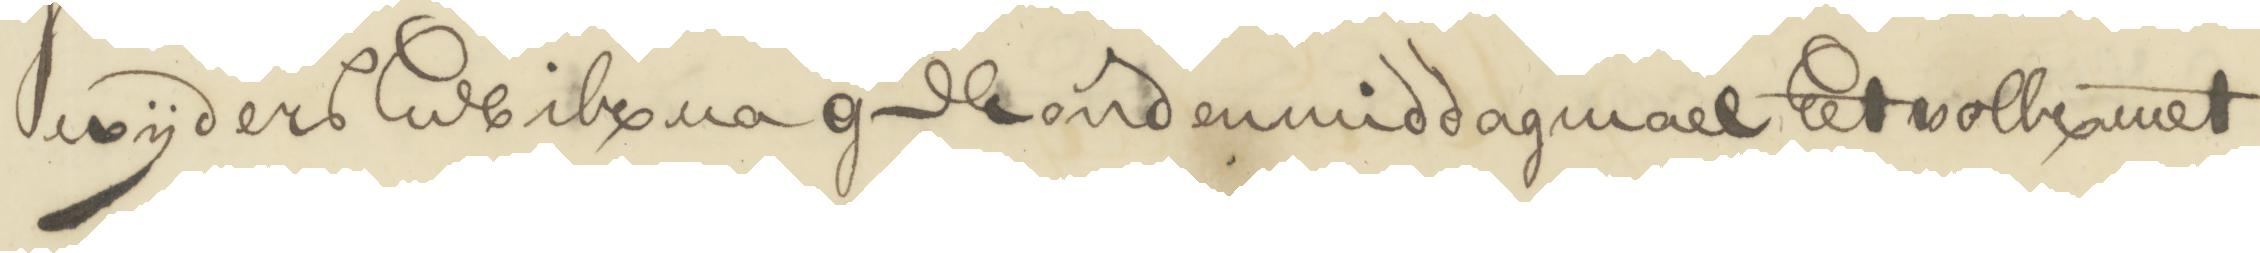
wijders heb ik na gehouden middagmael het volk met
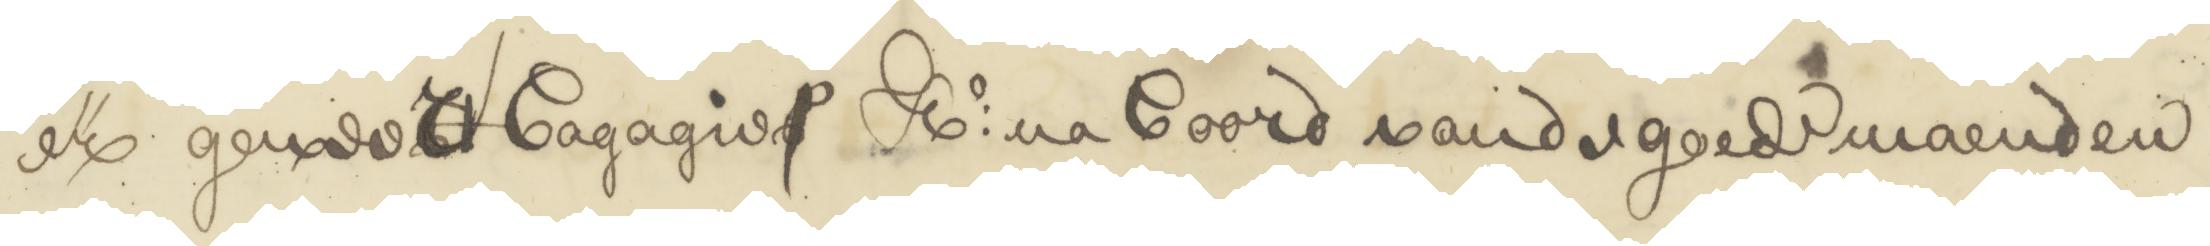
er geweert bagagies VE:o na boord van de goede maenden
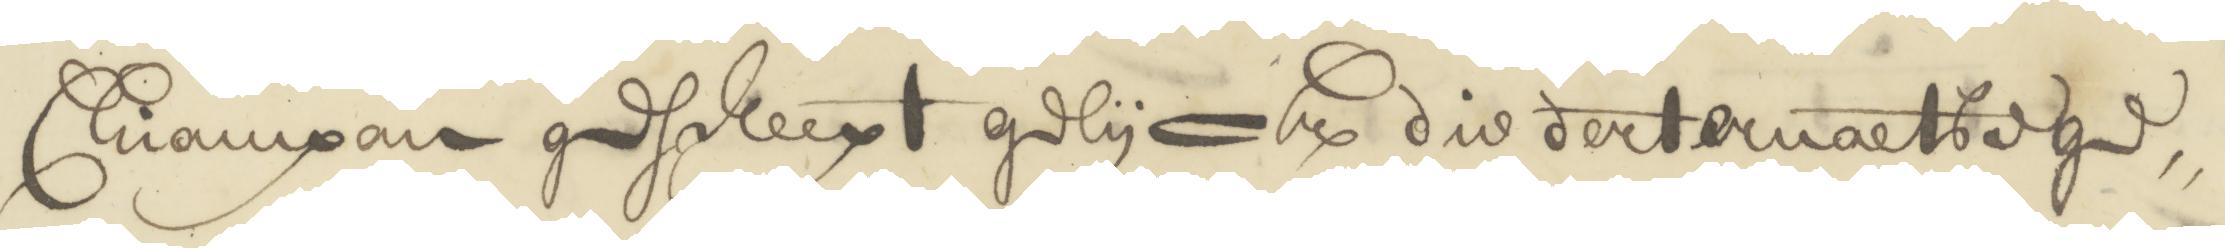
Chiampan gescheept gelijck die derternaetse ge„
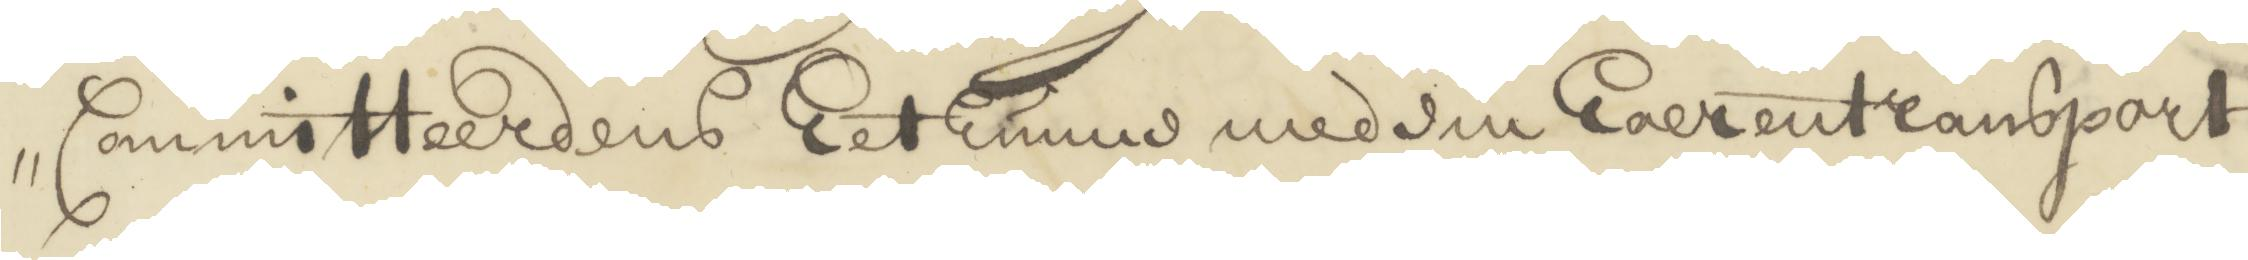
„committeerdens het hunne mede in haerentransport
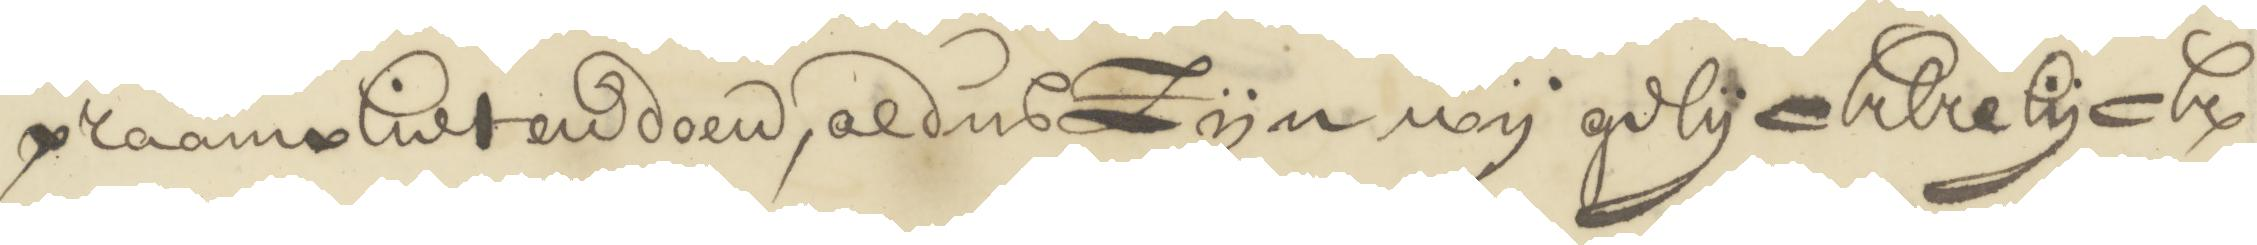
praauw lieten doen, aldus zijn wij gelijckkelijck
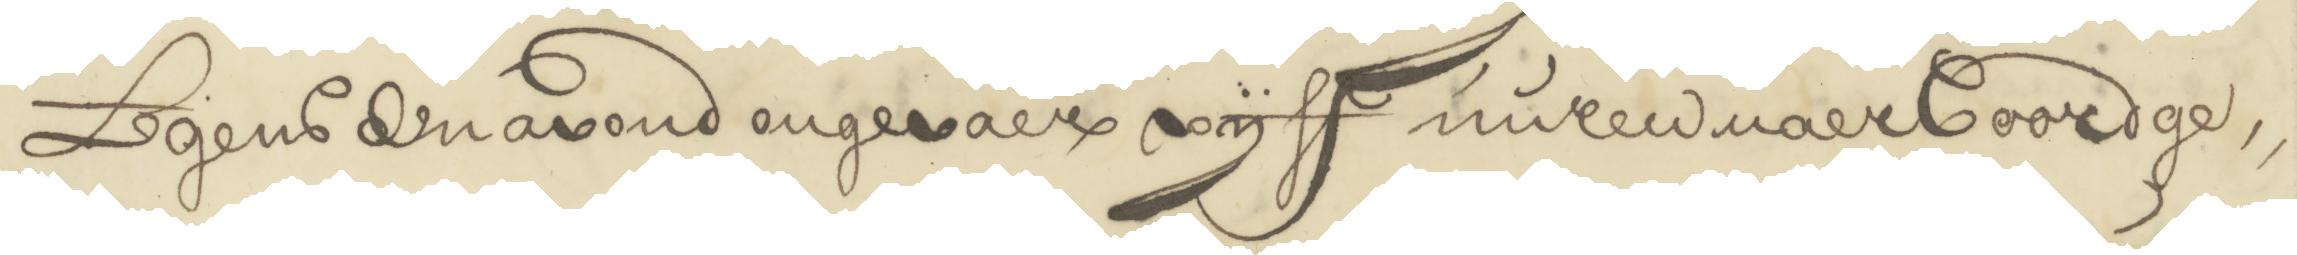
tegens den avond ongevaer vijff uuren naer boord ge„
